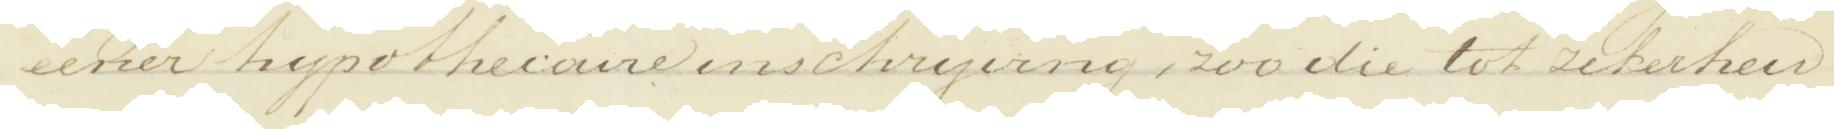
eener hypothecaire inschryving zoo die tot zekerheid
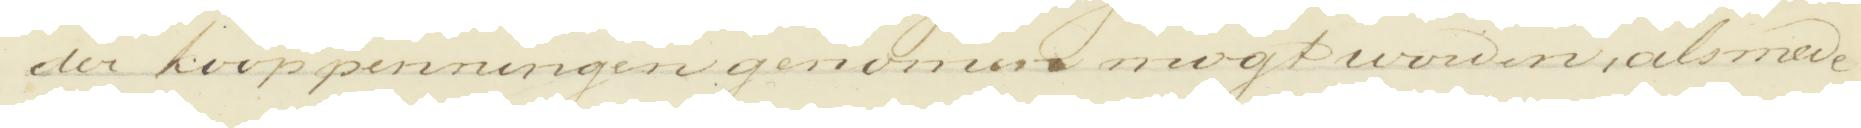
der kooppenningen genomen mogt worden alsmede
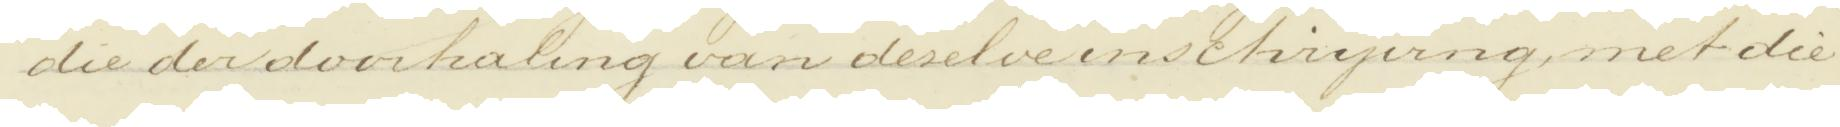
die der doorhaling van dezelve inschryving, met die
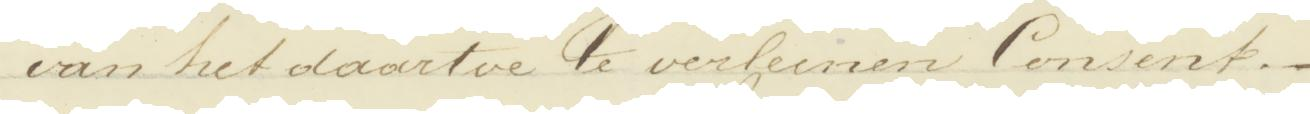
van het daartoe te verleenen Consent.-
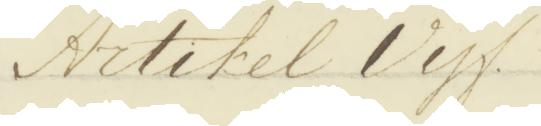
Artikel Vyf.
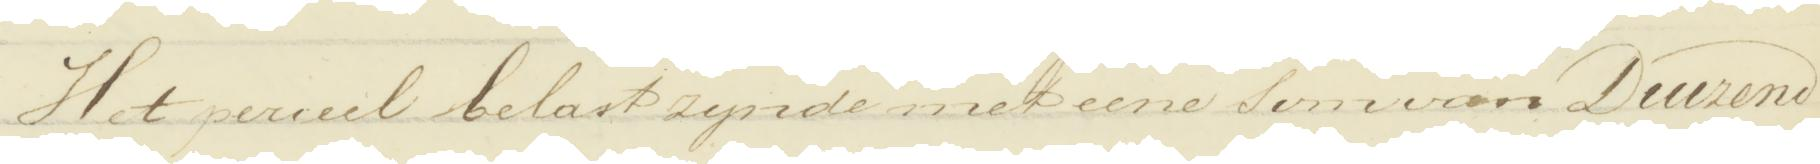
Het perceel belast zijnde met eene som van Duizend
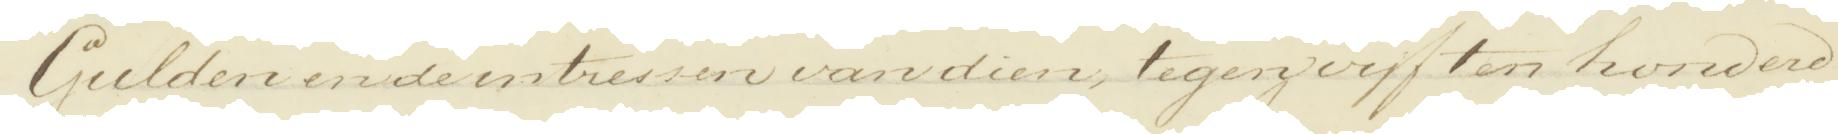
Gulden en de intressen van dien, tegen vyf ten honderd
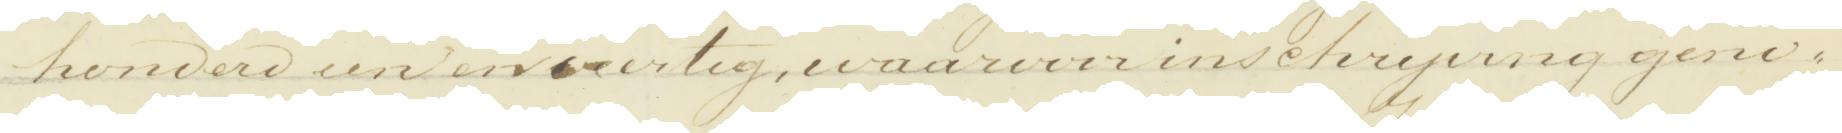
honderd een en veertig, waarvoor inschrijving geno„
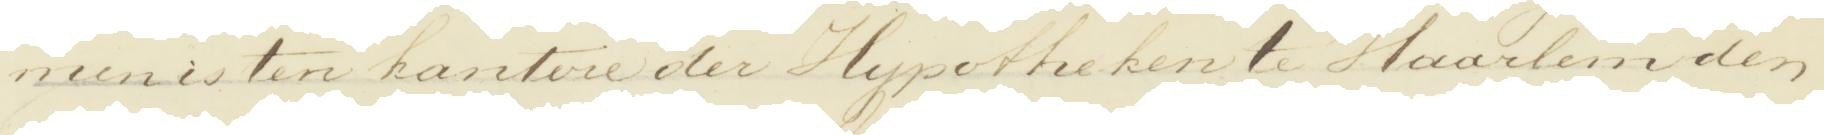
men is ten kantore der Hypotheken te Haarlem den
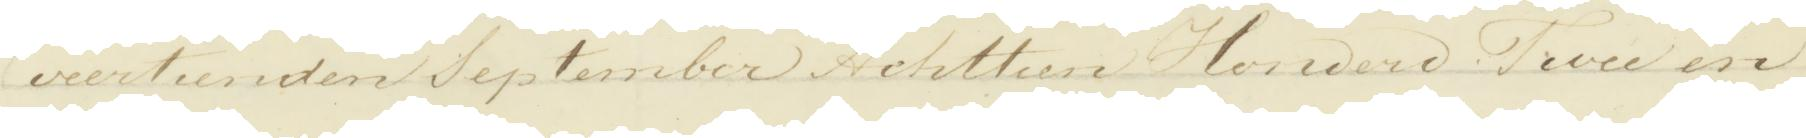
veertienden September Achttien Honderd Twee en
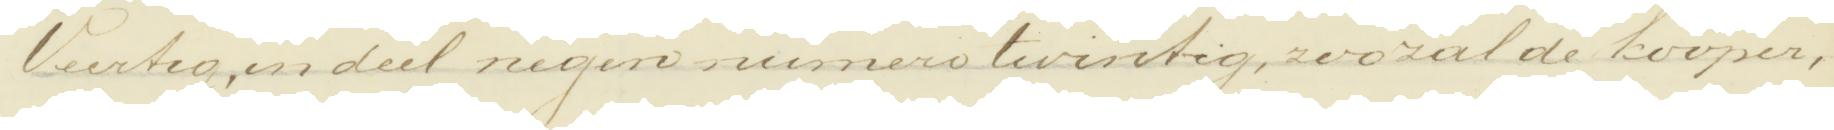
Veertig, in deel negen numero twintig, zoo zal de kooper,
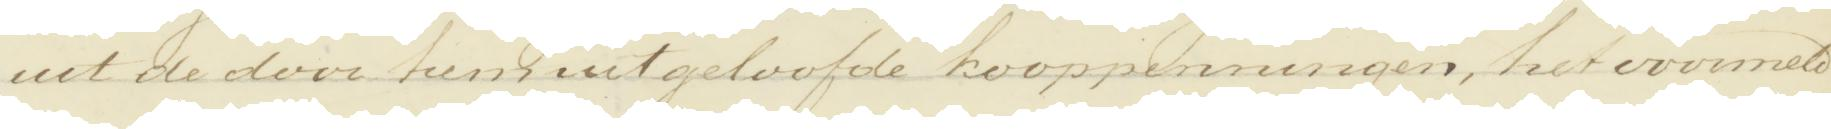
uit de door hem uitgeloofde kooppenningen, het voormeld
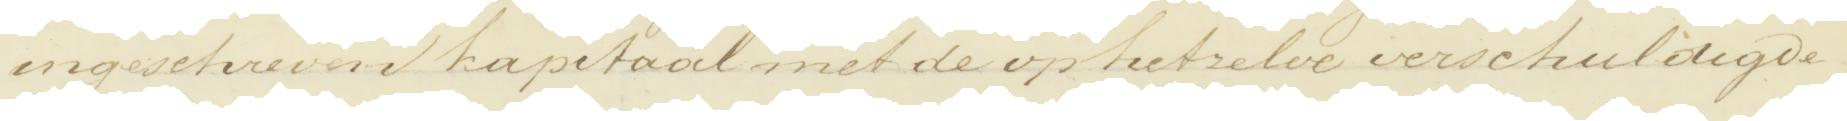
ingeschreven kapitaal met de op hetzelve verschuldigde
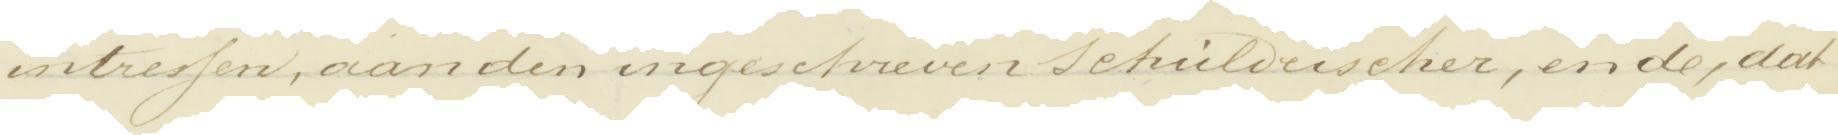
intressen, aan den ingeschreven schuldeischer, en de, dat
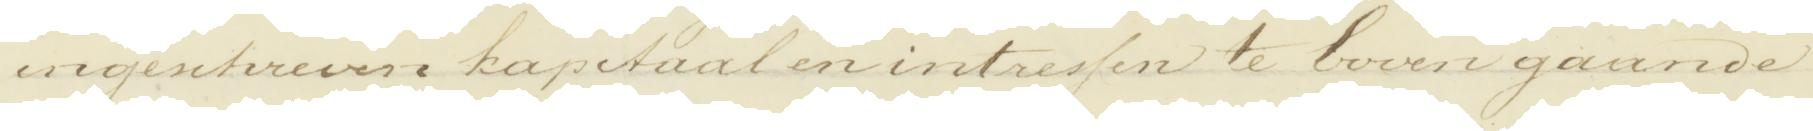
ingeschrevene kapitaal en intressen te boven gaande
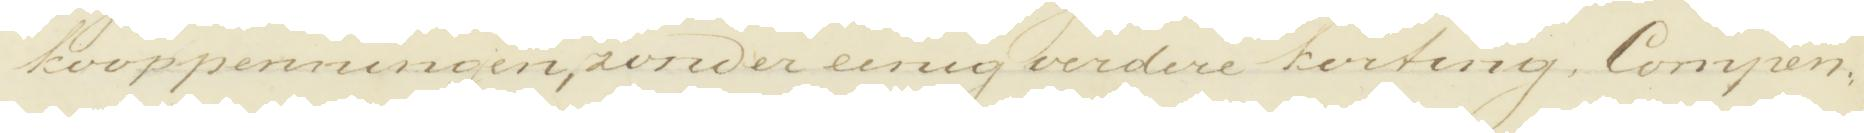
kooppenningen, zonder eenig verdere korting, Compen„
